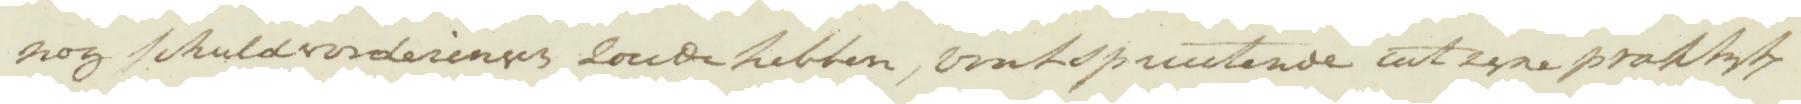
nog schuldvorderingen zoude hebben, voortspruitende uit zyne praktyk
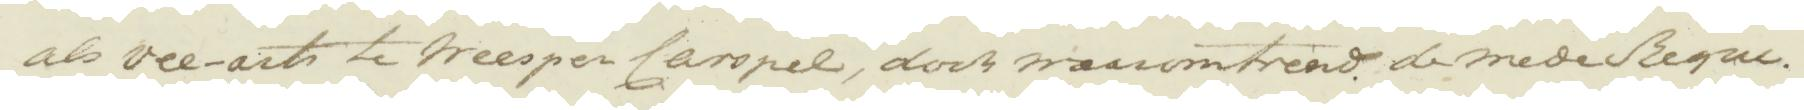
als vee-arts te Weesp en Carspel, door waaromtrend, de mede Requi.
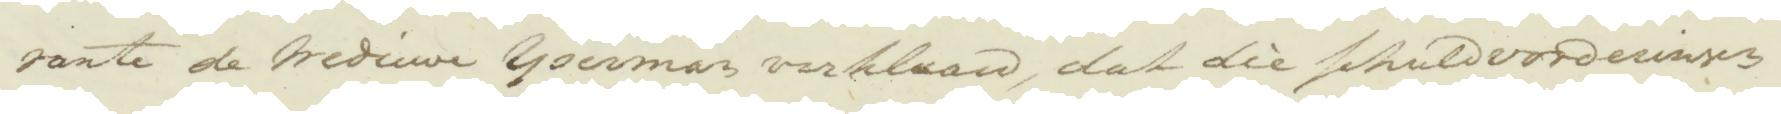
rante de weduwe Yserman verklaard, dat die schuldvorderingen
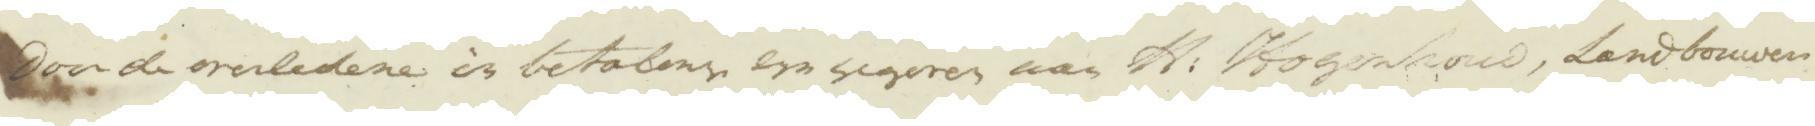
door de overledene in betaling zijn gegeven aan H: Hogenhoud, Landbouwer
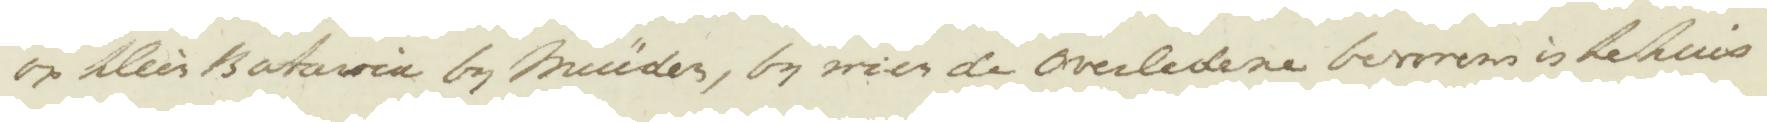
op klein Batavia by muïden, by wien de overledene bevorens is te huis
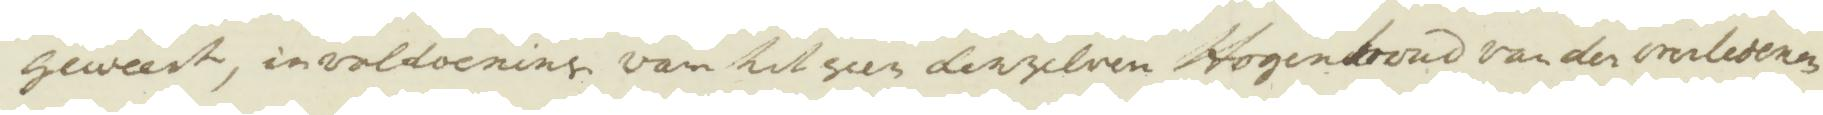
geweest, in voldoening van het geen denzelven Hogenhoud van den overledenen
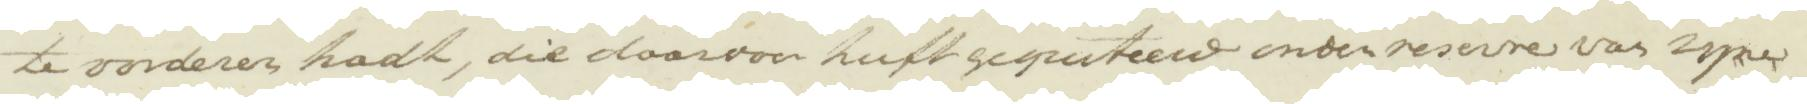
te vorderen hadt, die doorvoor heeft gequiteerd onder reserve van zyner
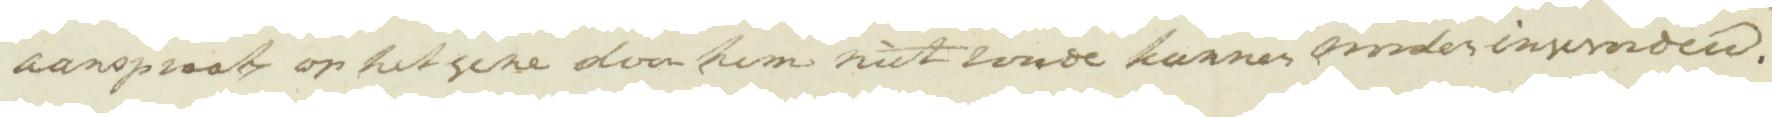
aanspraak op het gene door hem niet zoude kunnen worden ingevorderd
